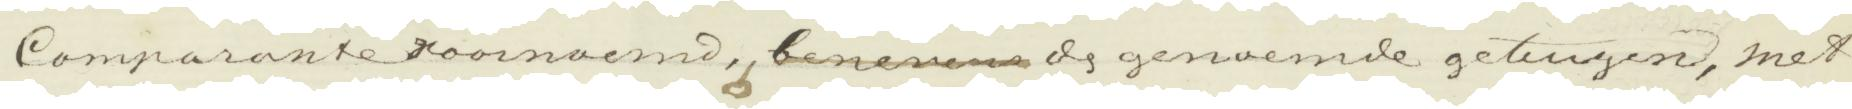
Comparante voornoemd, ¶ benevens de genoemde getuigen, met
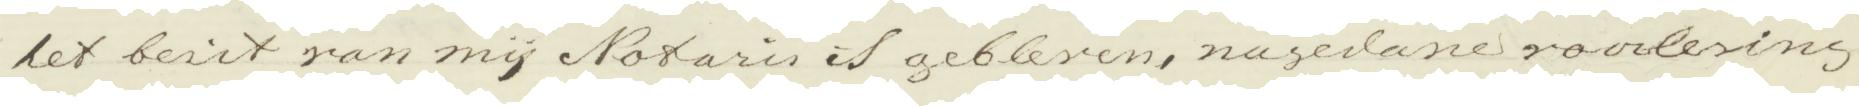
het bezit van mij Notaris is gebleven, nagedane voorlezing
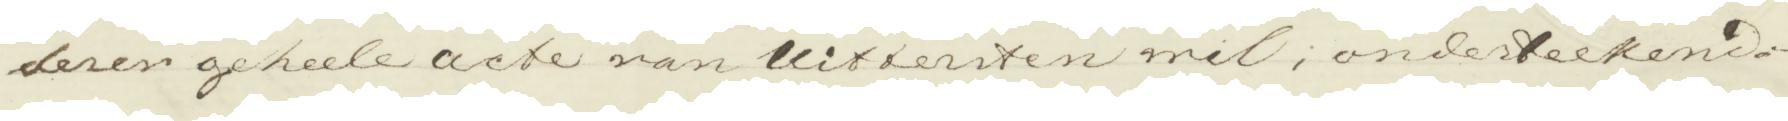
dezer geheele acte van uittersten wil; onderteekend;
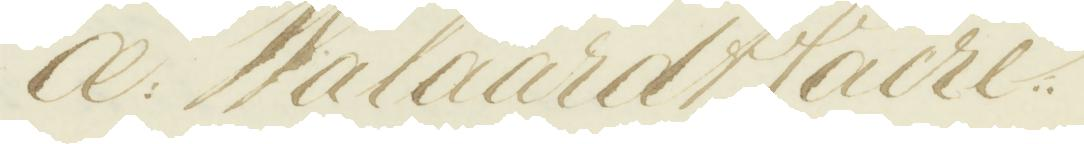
AE: Walaardt Sacré..
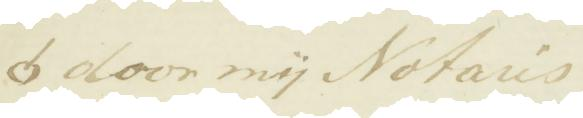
¶ door mij Notaris
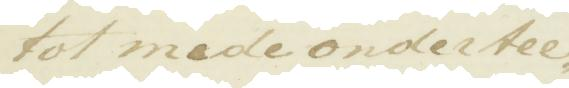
tot mede ondertee
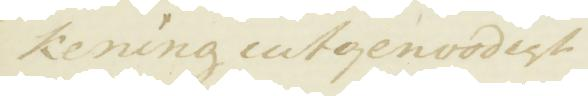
kening uitgenoodigt
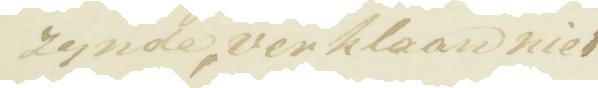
zynde, verklaard niet
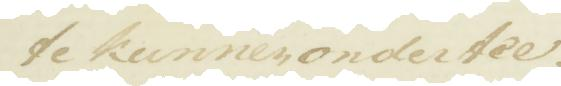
te kunnen ondertee
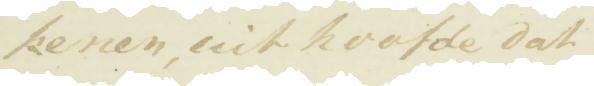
kenen, uit hoofde dat
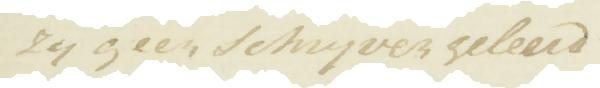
zy geen schryven geleerd
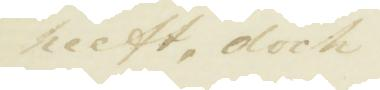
heeft, doch
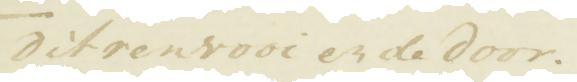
dit renvooi en de door.
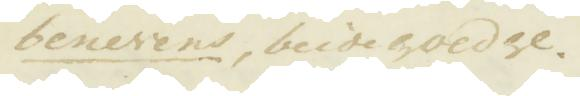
benevens, beide goedge.
